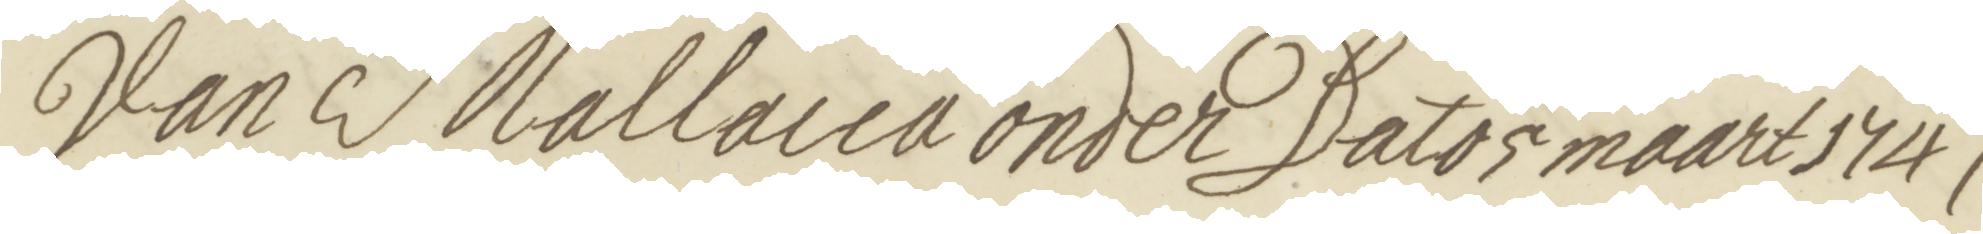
Van Mallacca onder Dato 5 maart 174
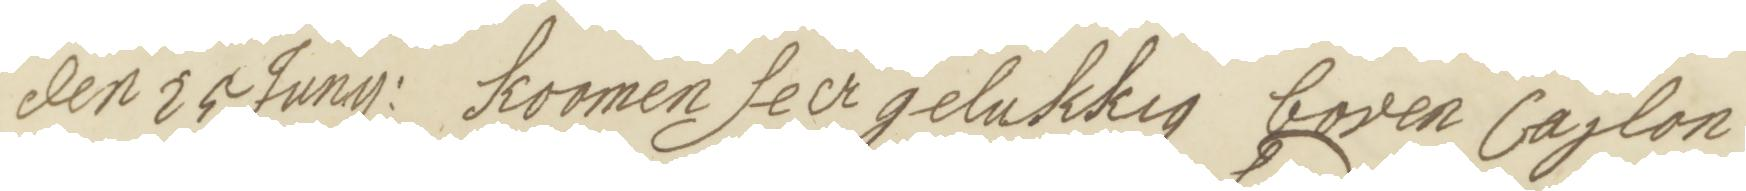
den 25 Juny: koomen seer gelukkig boven Cajlon
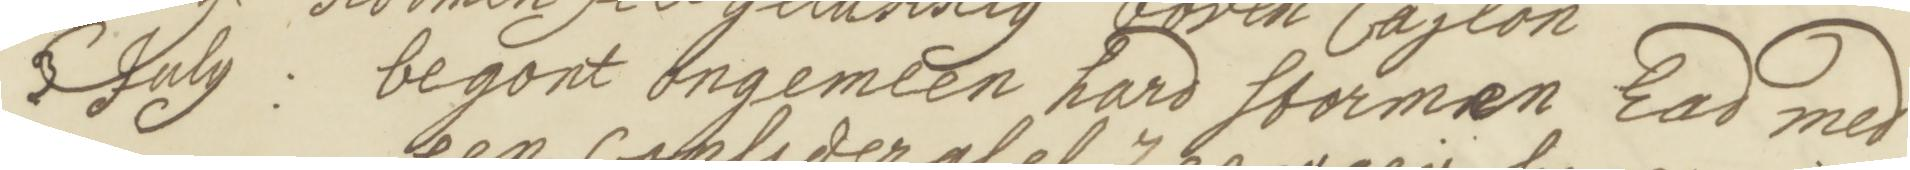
3 July : begont ongemeen hard stormen had med
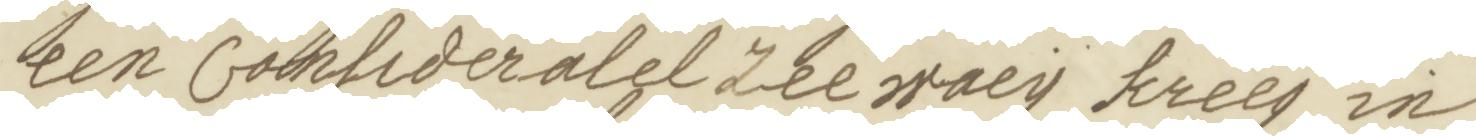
een consideralel zee waeij kreeg in
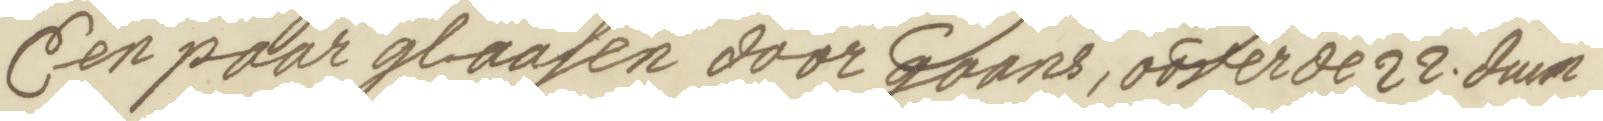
Een paar glaasen door gaans, oover de 22. duim
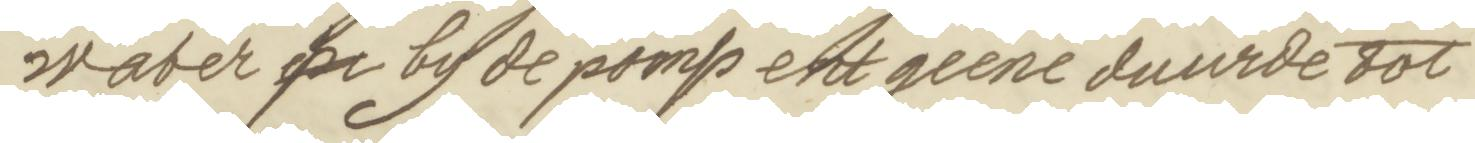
water pr by de pomp ent geene duurde tot
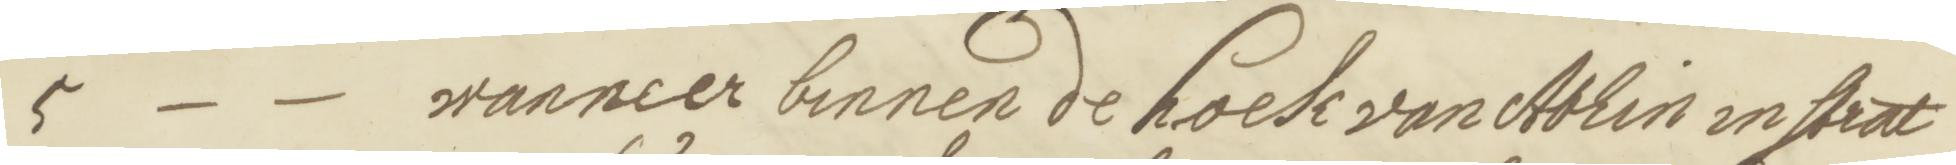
5 — — wanneer binnen de hoek van Athin in strat
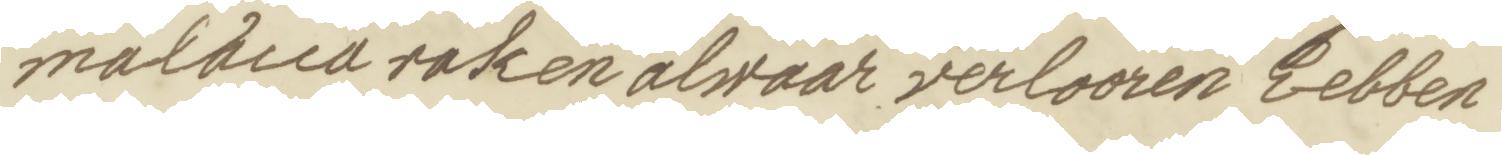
malacca raken alwaar verlooren hebben
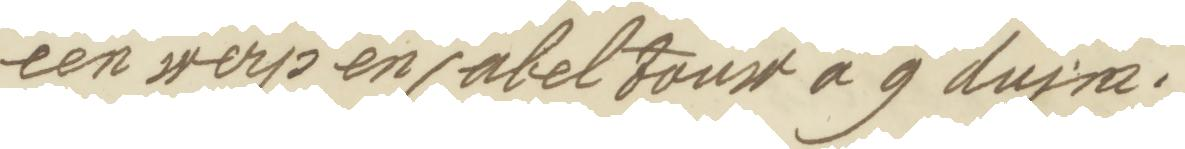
een werp en cabeltouw a 9 dujm.
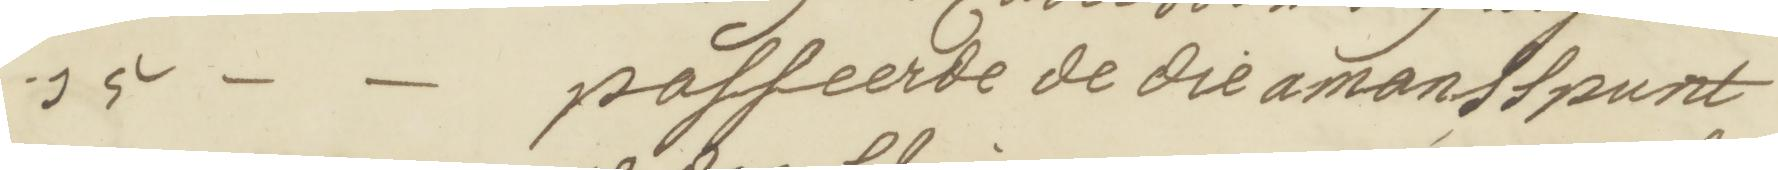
15 — — passeerde de die amansspunt.
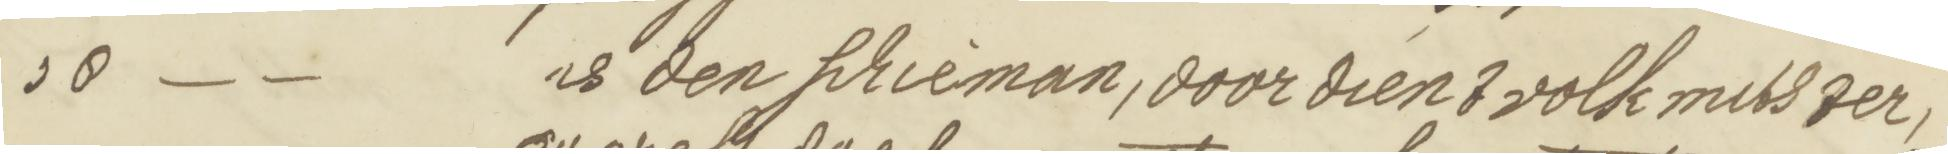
18 — — is den schieman, door dien t volk mits ter,
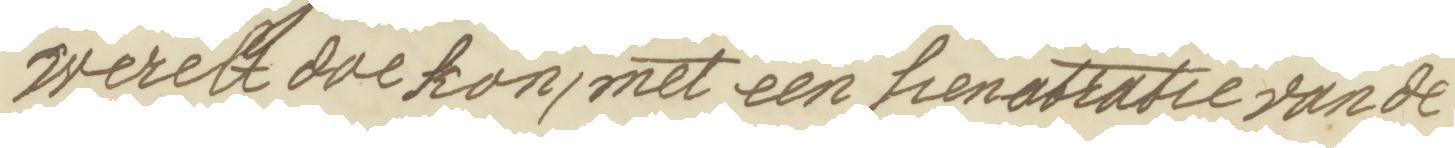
werelt doe kon, met een sienatratie van de
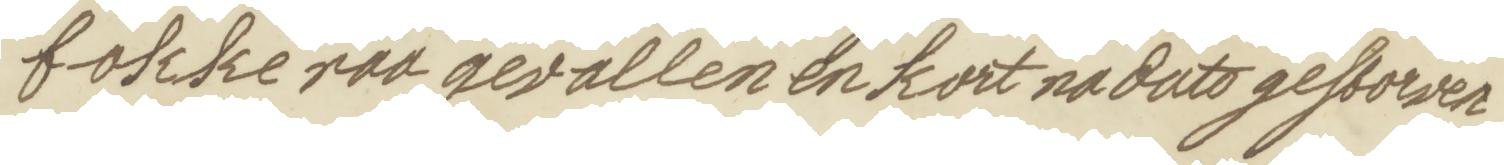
fokke raa gevallen en kort na dato gestorven
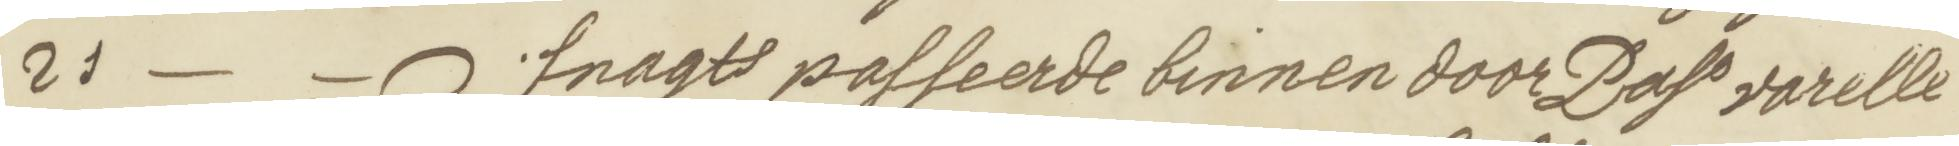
21 — — 'Snagts passeerde binnen door Paso varelle
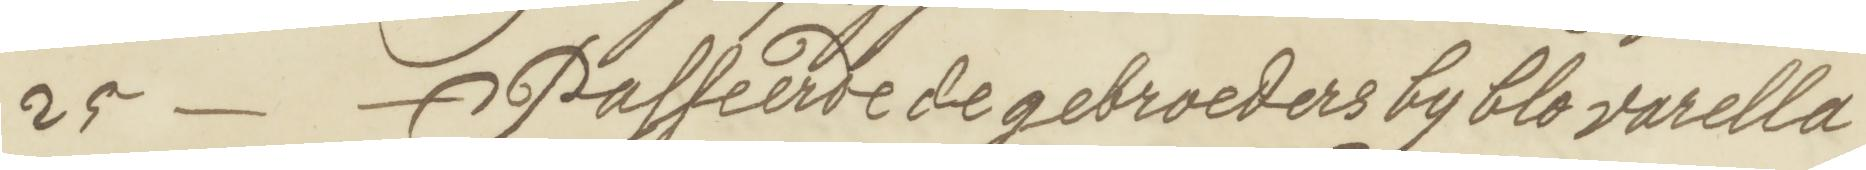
25 — — Passeerde de gebroeders by blo varella
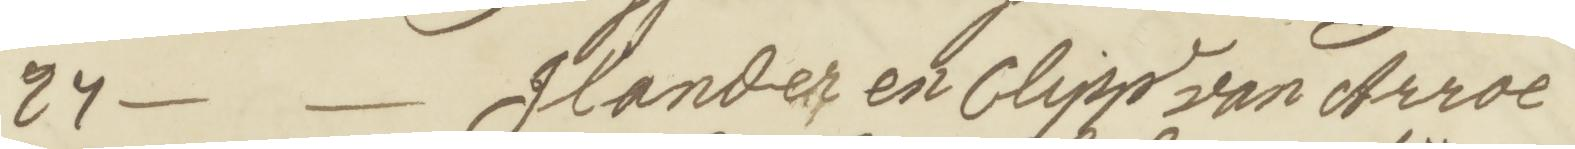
27 — — Jlander en Clipp van Arroe
